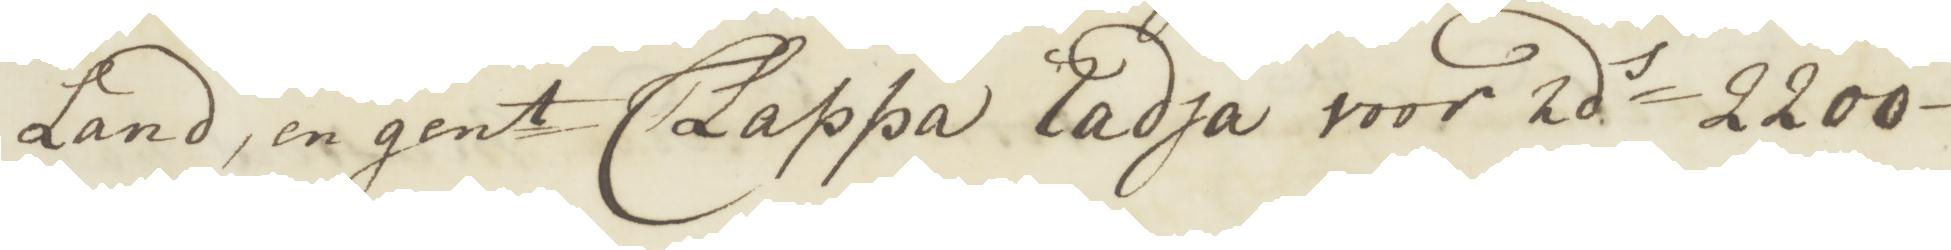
Land, en gen=t Clappa Radja voor rd=s 2200 —
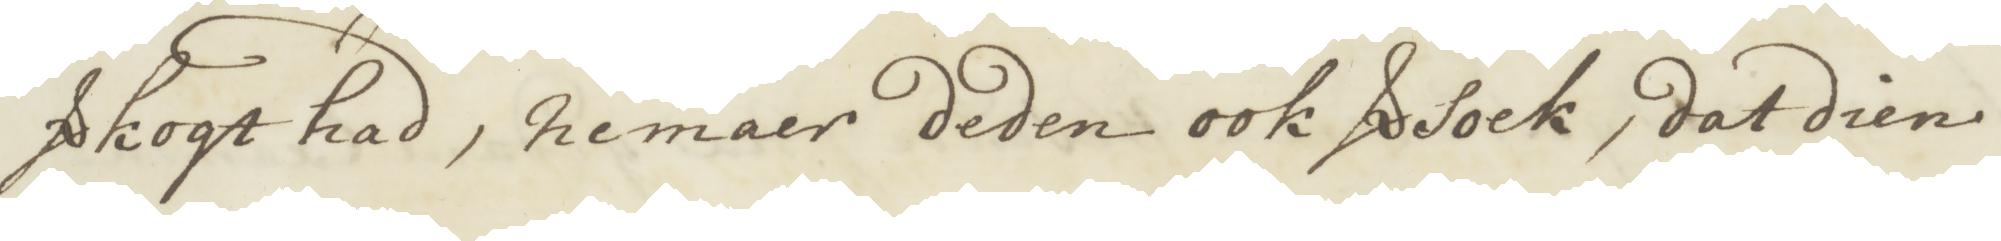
verkogt had, Nemaer deden ook versoek, dat dien
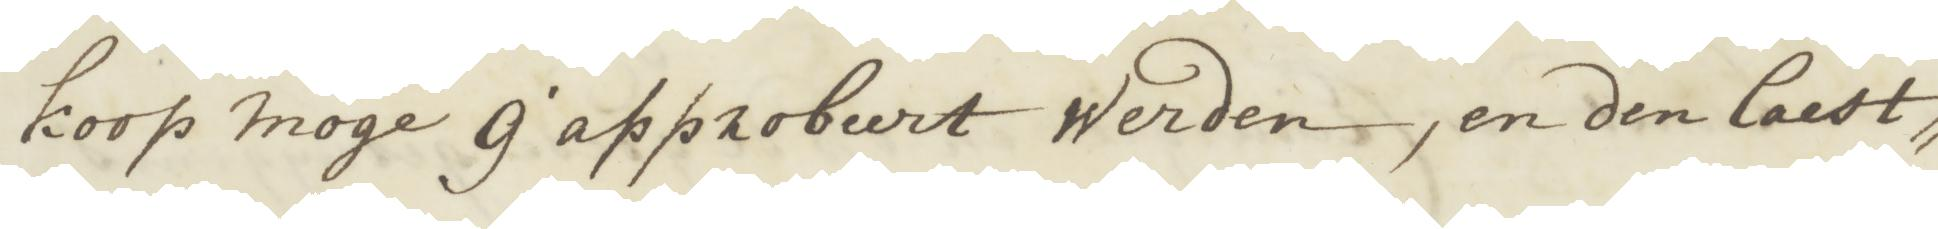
koop moge g’approbeert werden, en den laest„
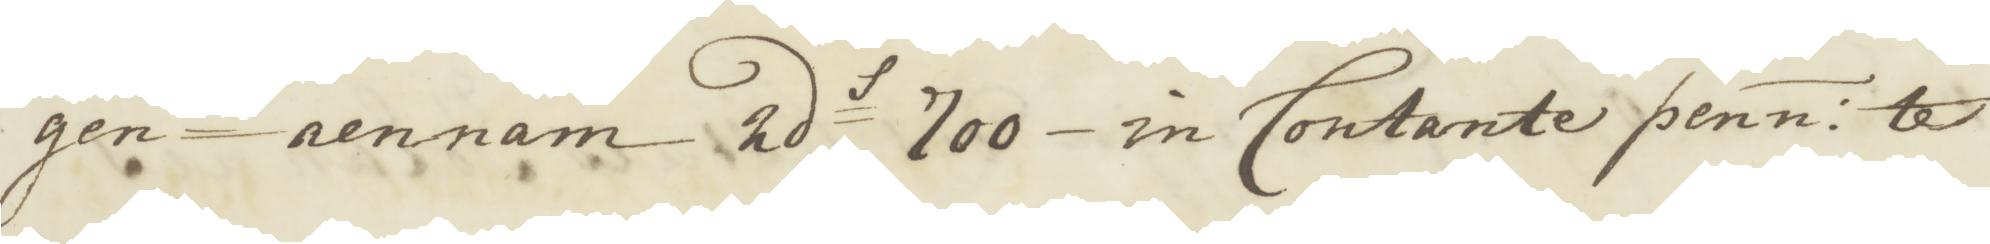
gen=de aennam rd=s 700 - in Contante penn: te
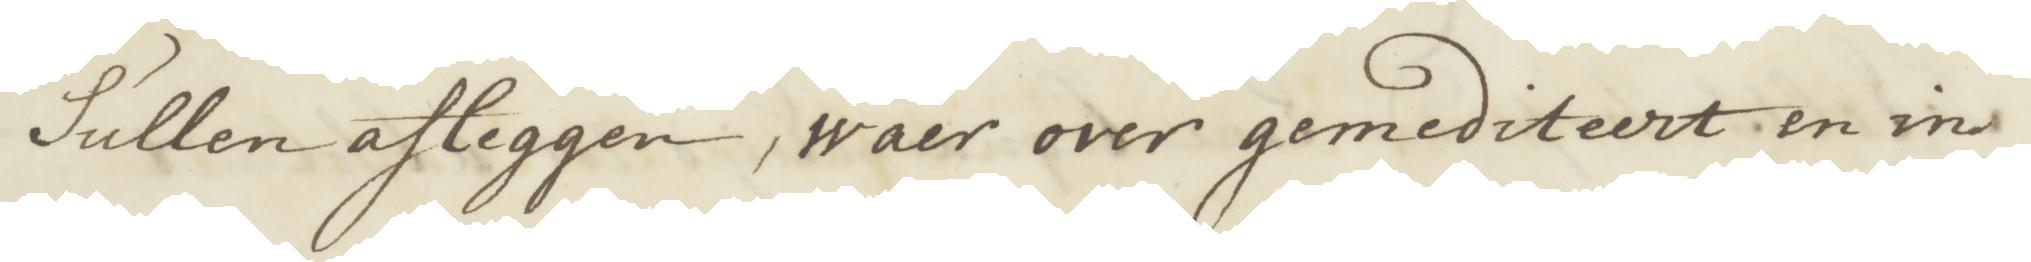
sullen afleggen, waer over gemediteert en in
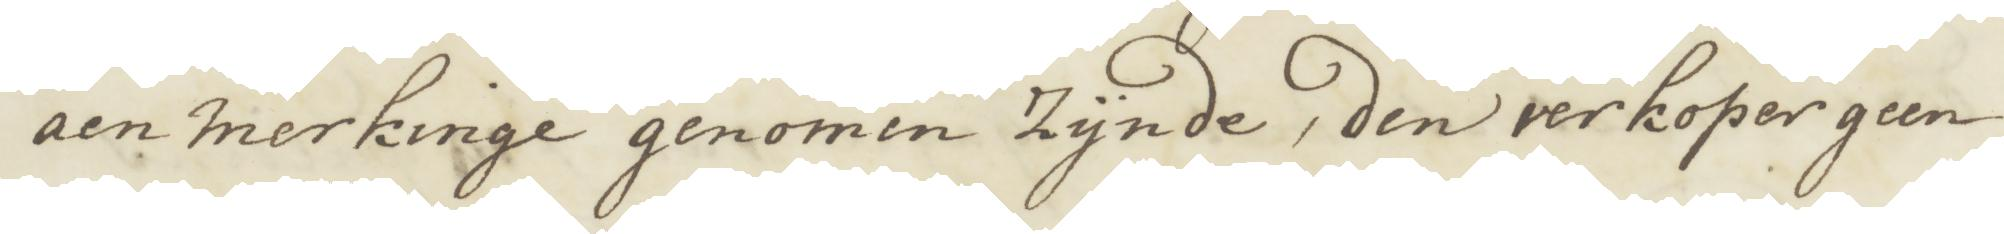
aen merkinge genomen zijnde, den verkoper geen
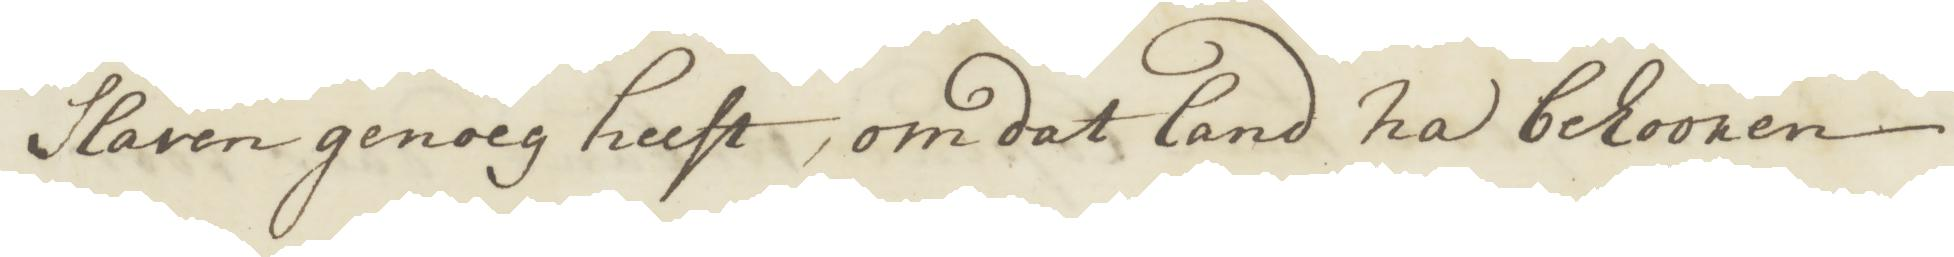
slaven genoeg heeft, om dat land Na behooren
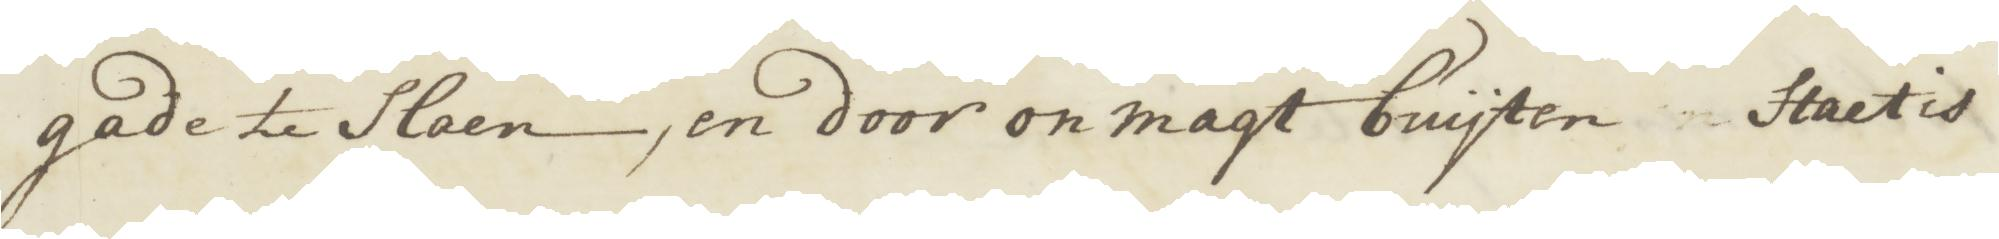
gade te slaen, en door on magt buijten staet is
